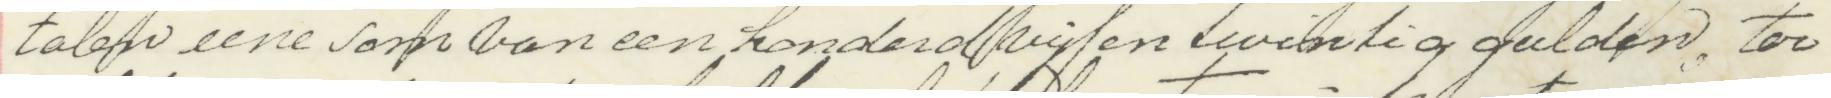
talen eene som van een honderd vijf en twintig gulden, ter
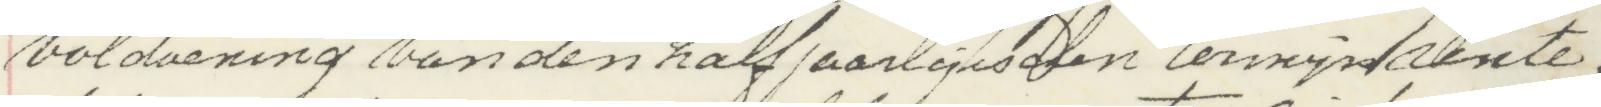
voldoening van den half jaarlijkschen termijn rente;
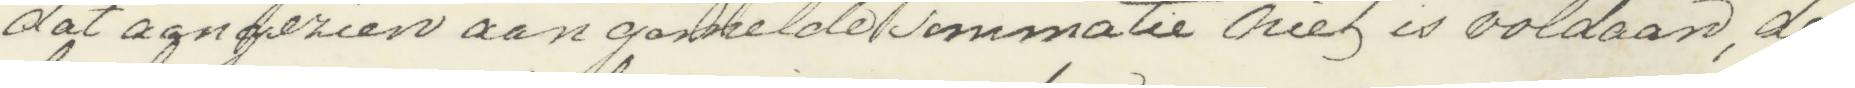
dat aangezien aan gemelde sommatie niet is voldaan, de
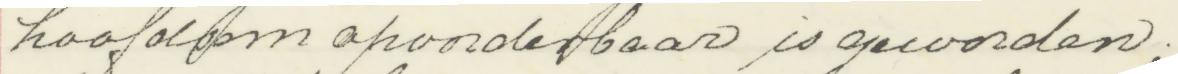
hoofdsom opvorderbaar is geworden
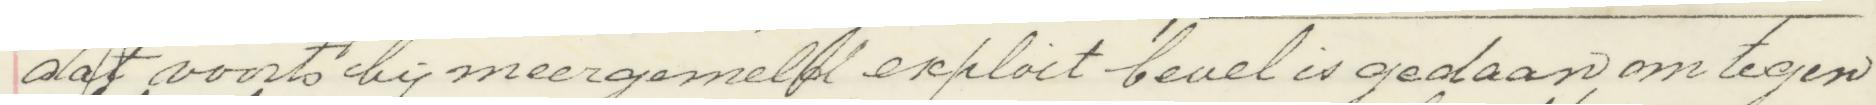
dat voorts hij meergemeld exploit bevel is gedaan om tegen
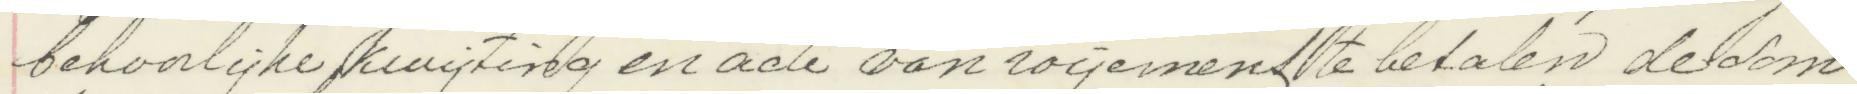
behoorlijke kwijting en acte van roijement te betalen de som
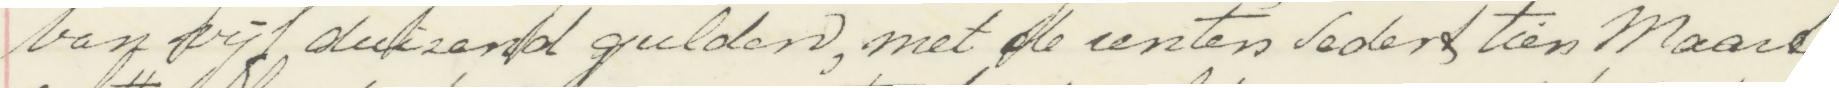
van vijf duizend gulden, met de renten sedert tien Maart
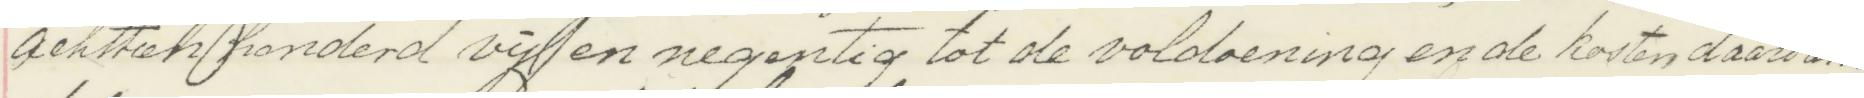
achttien honderd vijf en negentig tot de voldoening en de kosten daarvan
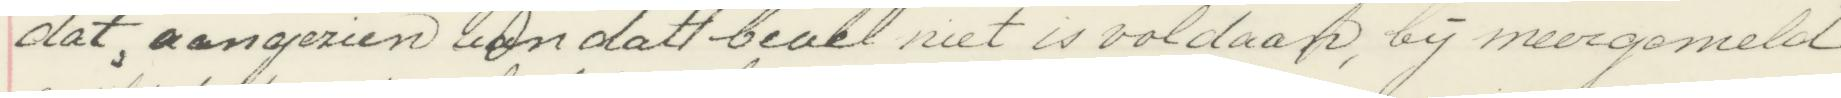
dat aangezien van dat bevel niet is voldaan, bij meergemeld
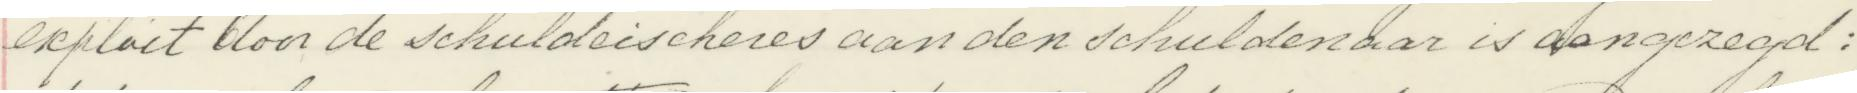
exploit door de schuldeischeres aan den schuldenaar is aangezegd
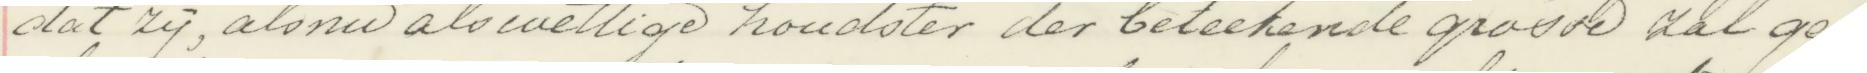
dat zij, als nu als wettige houdster der beteekende grosse zal ge-
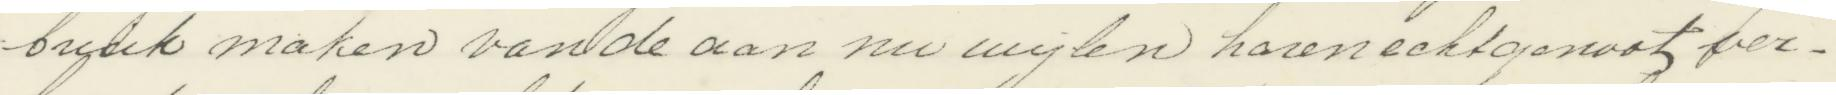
bruik maken van de aan nu wijlen haren echtgenoot ver-
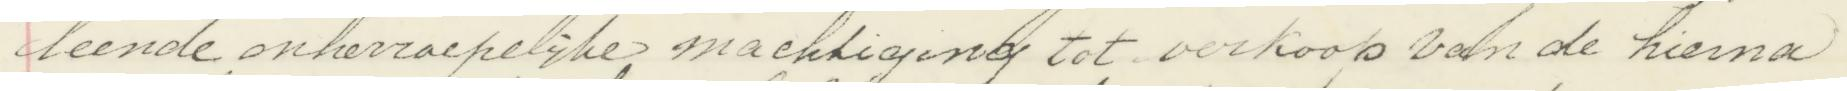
leende onherroepelijke machtiging tot verkoop van de hierna
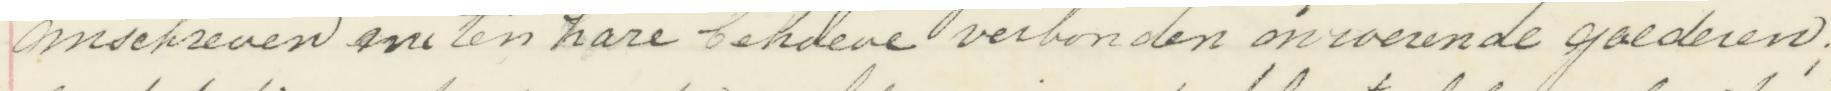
omschreven en ten hare behoeve verbonden onroerende goederen
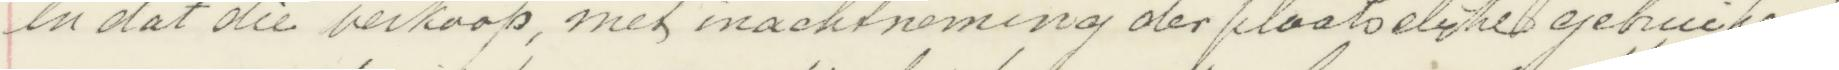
en dat die verkoop, met inachtneming der plaatselijke gebruiken
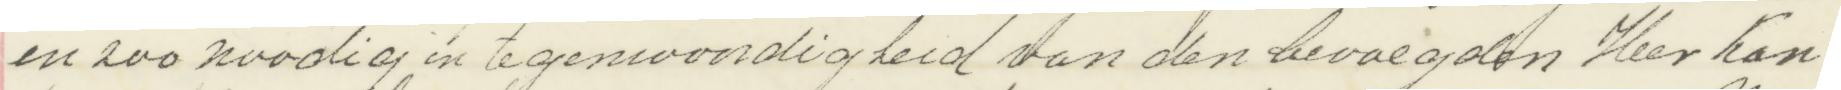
en zoo noodig in tegenwoordigheid van den bevoegden Heer Kan
